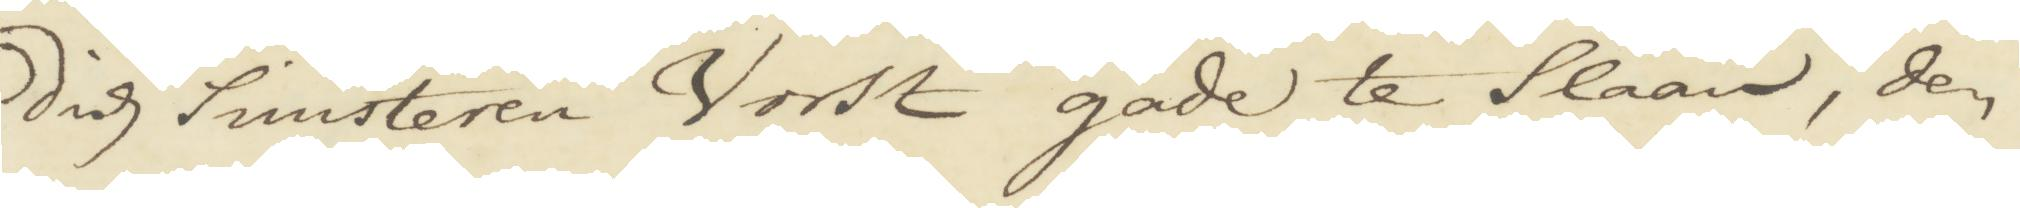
dien sinisteren Vorst gade te slaan, den
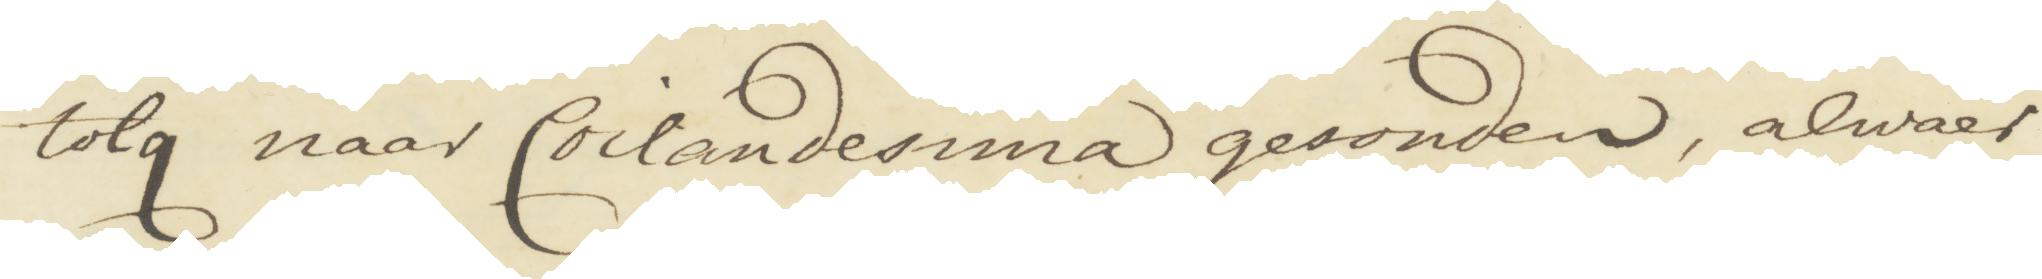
tolq naar Coilandesima gesonden, alwaer
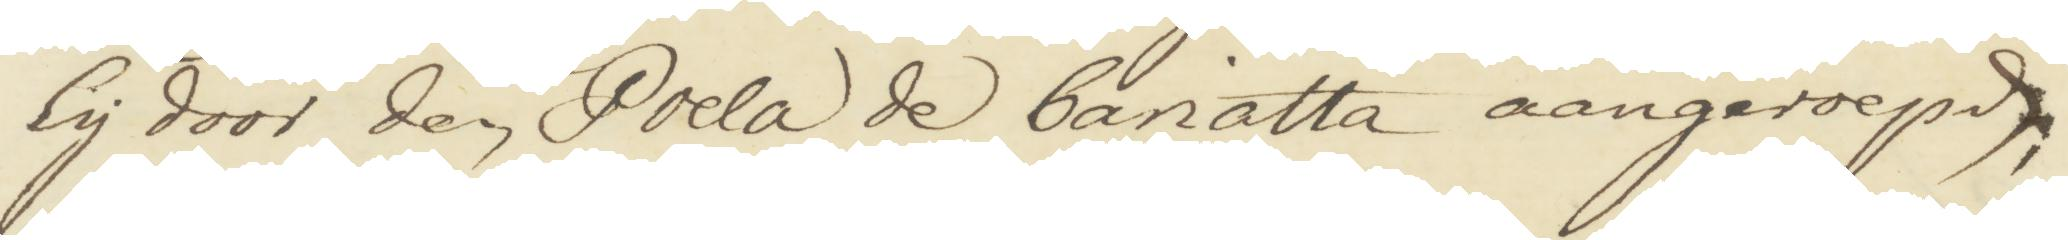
hij door den Poela de bariatta aangeroepen,
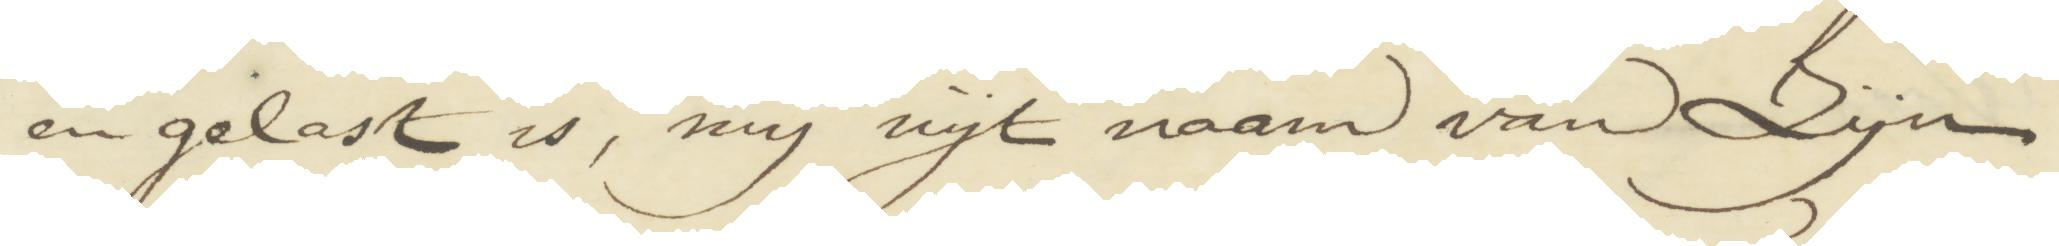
en gelast is, mij uijt naam van zijn
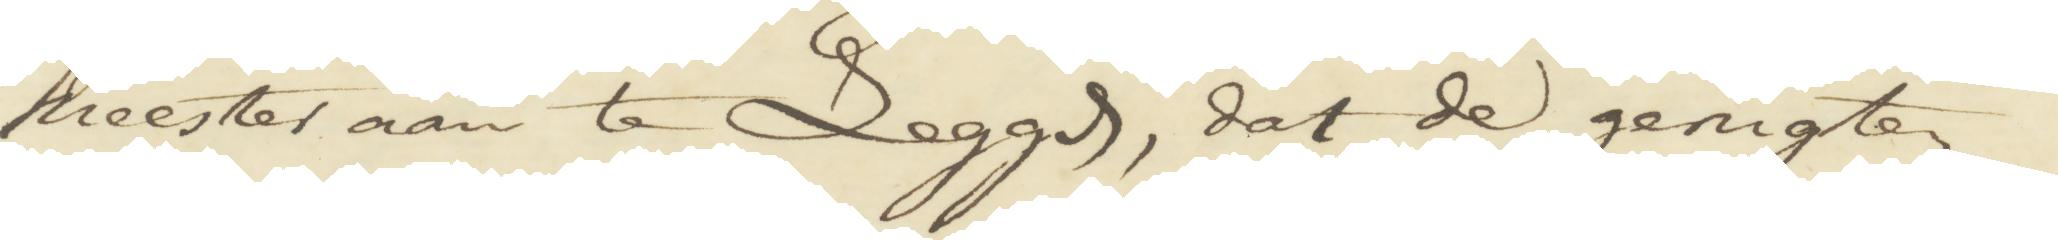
meester aan te zeggen, dat de gerugten
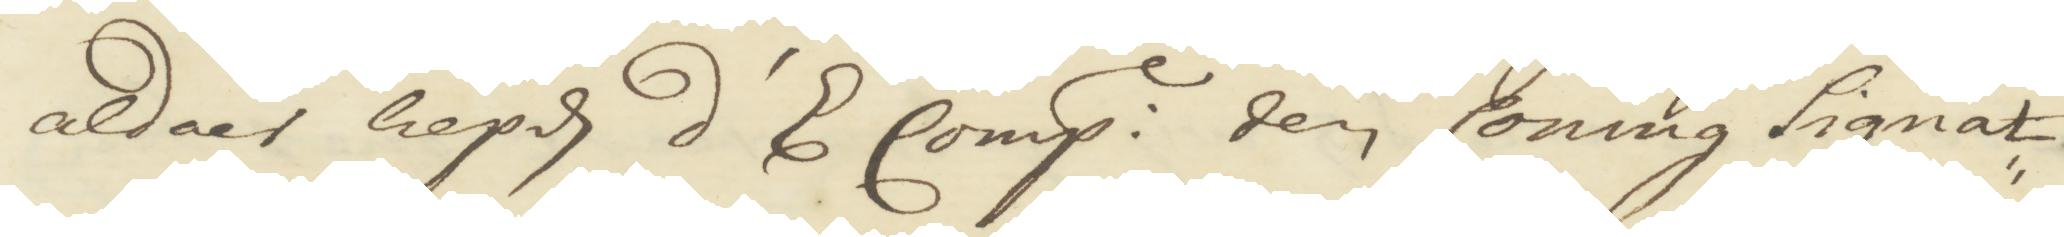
aldaer liepen d’ E Comp:e den Coning signat„
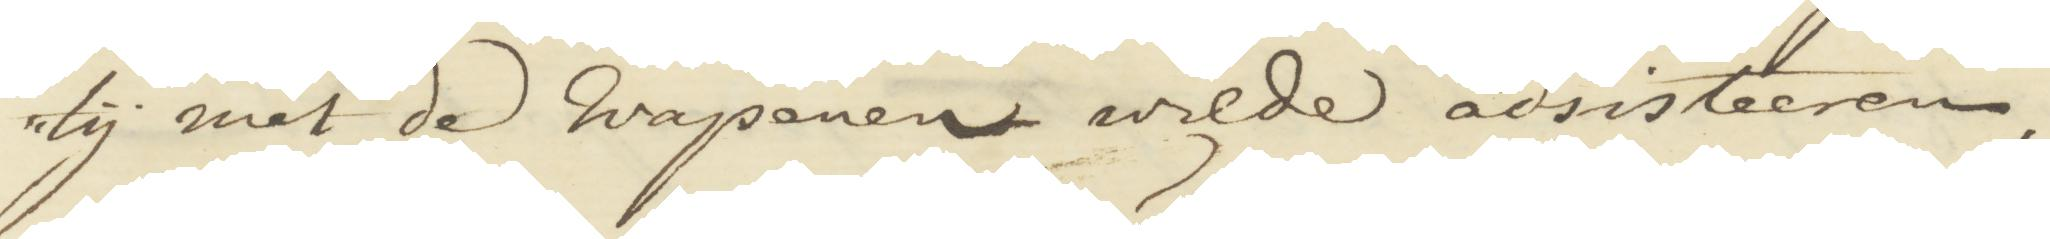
„tij met de wapenen wilde adsisteeren,
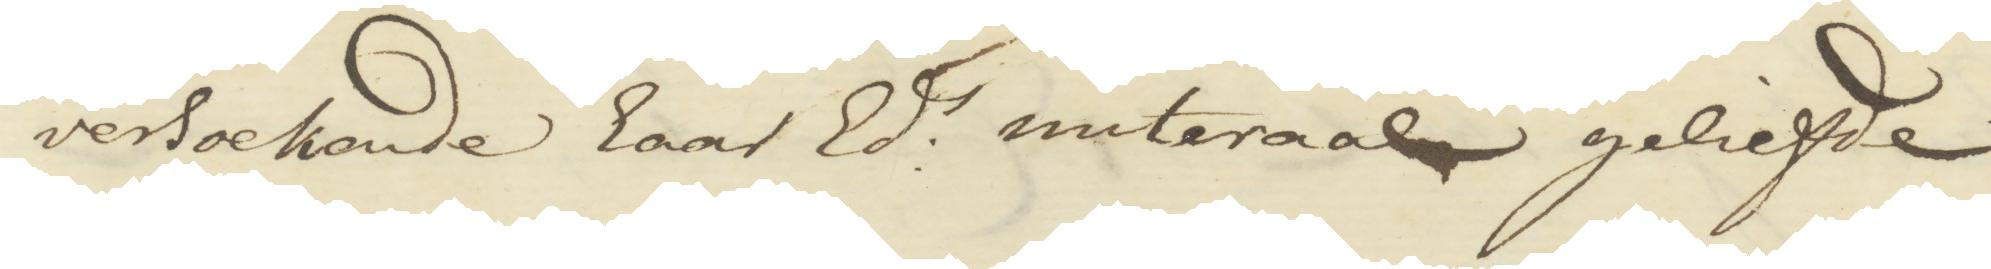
versoekende haar Ed:s nuteraal geliefde
